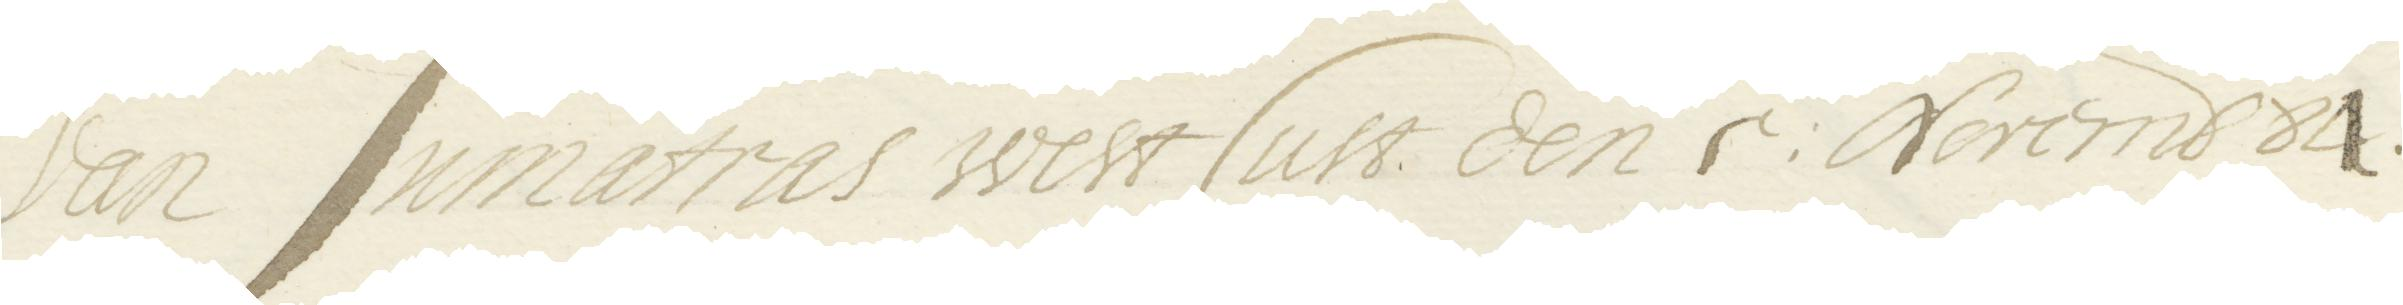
Van Sumatras west Cust den 5': Novemb: 84
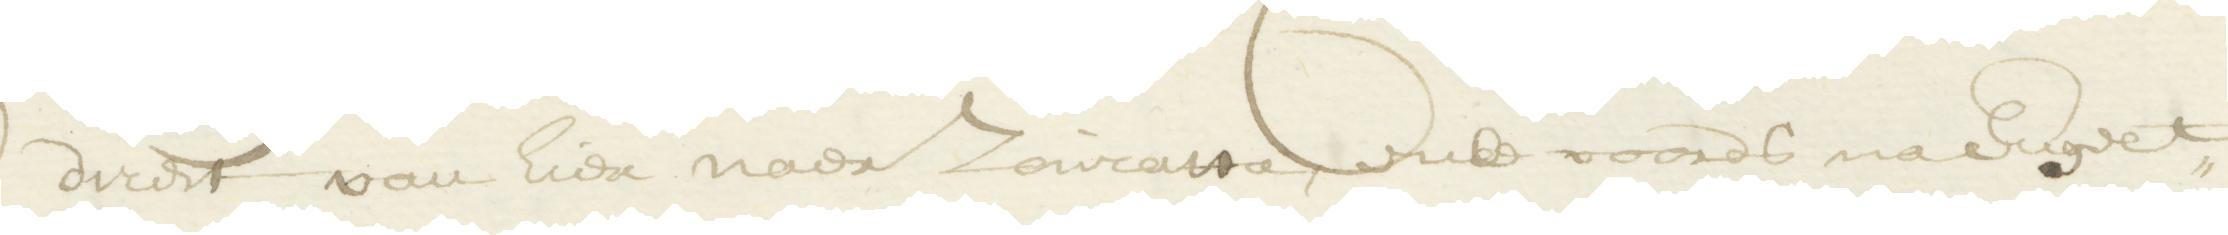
direct van hier naer Zouratta ende voords na Engel„t
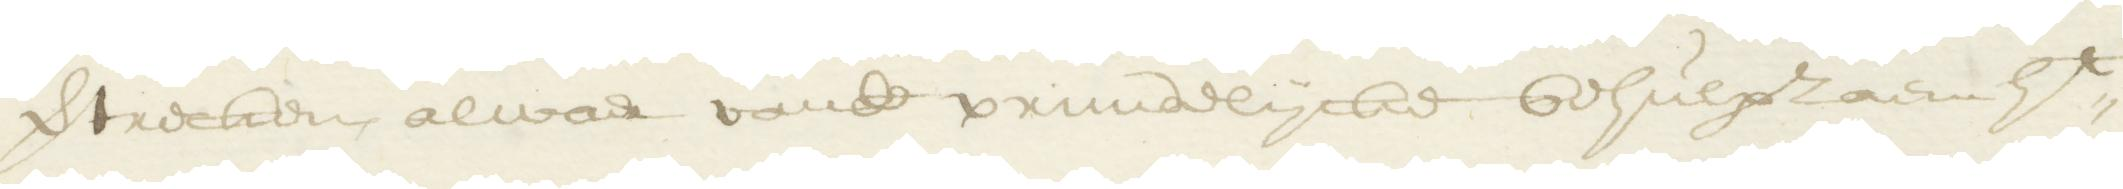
vertrecken, alwaer vande vrundelijcke behulpzaemh„t
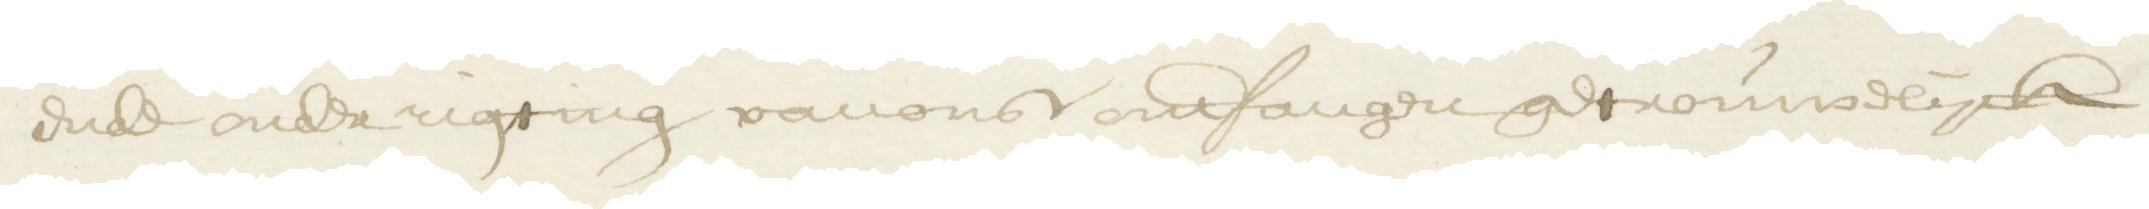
ende onder rigting van onst ontfangen getrouwelijck
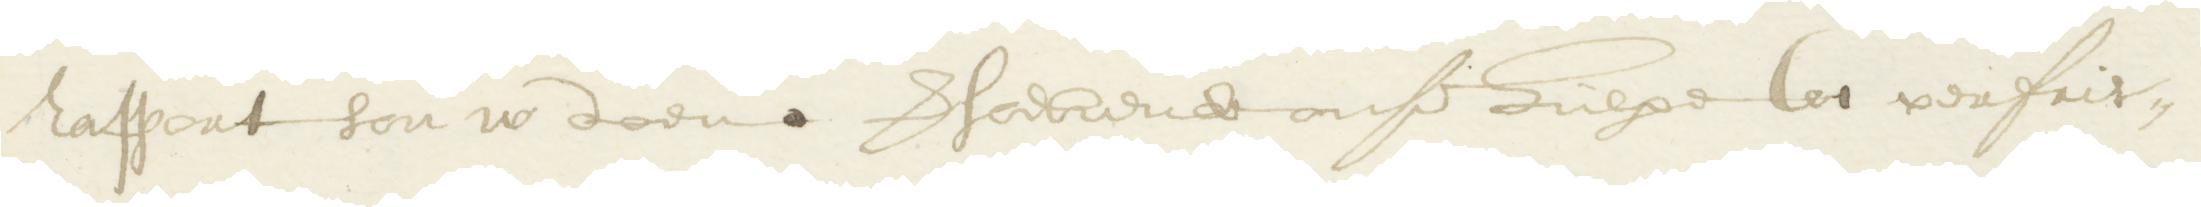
rapport sou w doen. versoekende onse hulpe tot verfris„
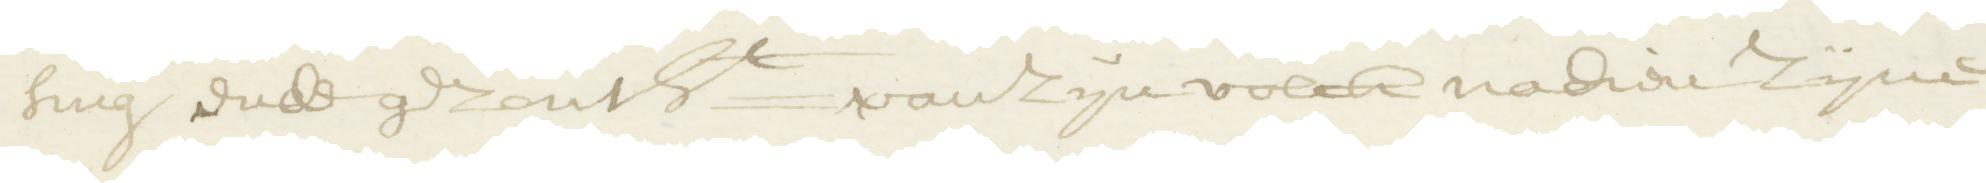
sing ende gezonth-t van Zijn volck nadien Zijne
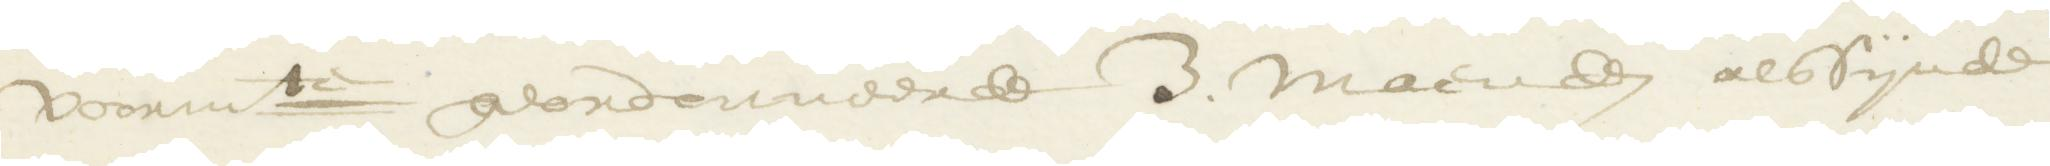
voorm_te geordonneerde 3. maenden als sijnde
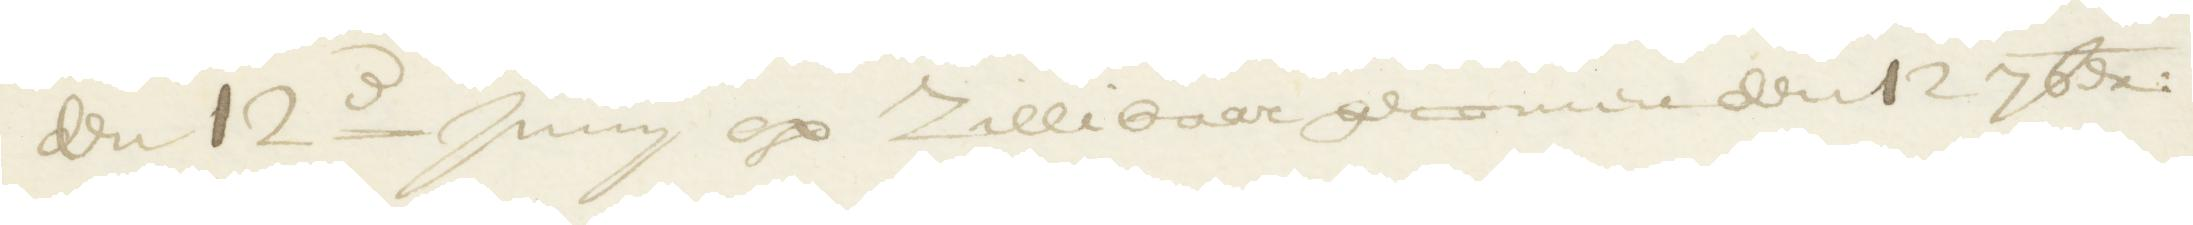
den 12=e Junij op Zillibaar gecomen den 12. 7ber:
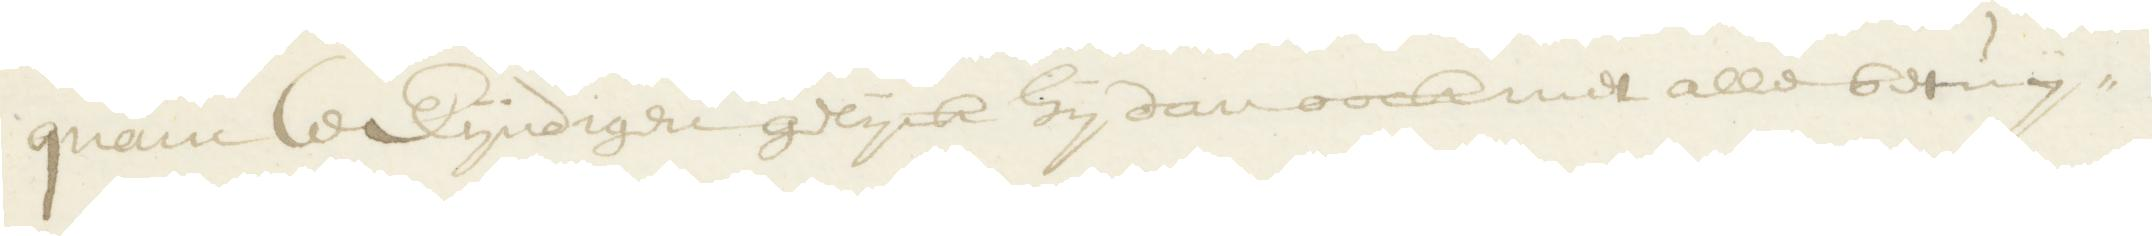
quam te Eijndigen gelijck hij dan oock met alle betuij„
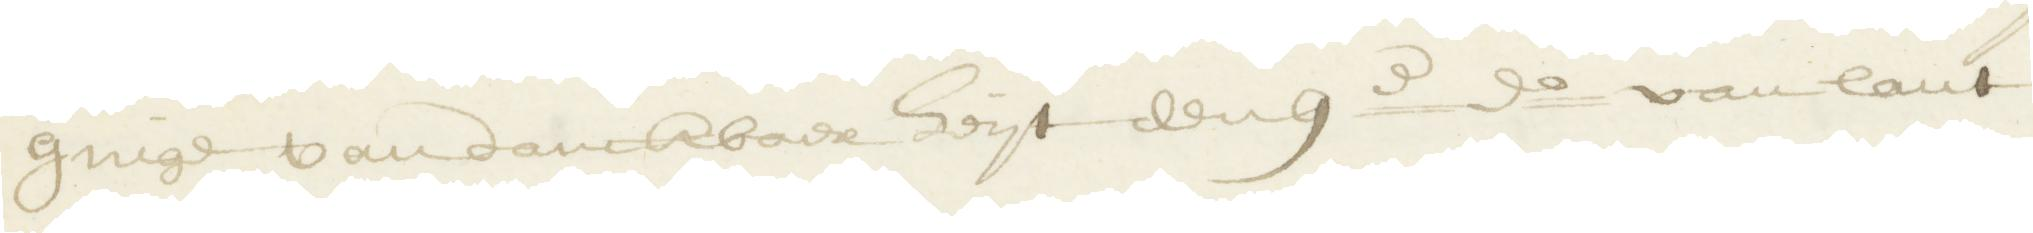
ginge van danckbaer heijt den 9:e d=o van lant
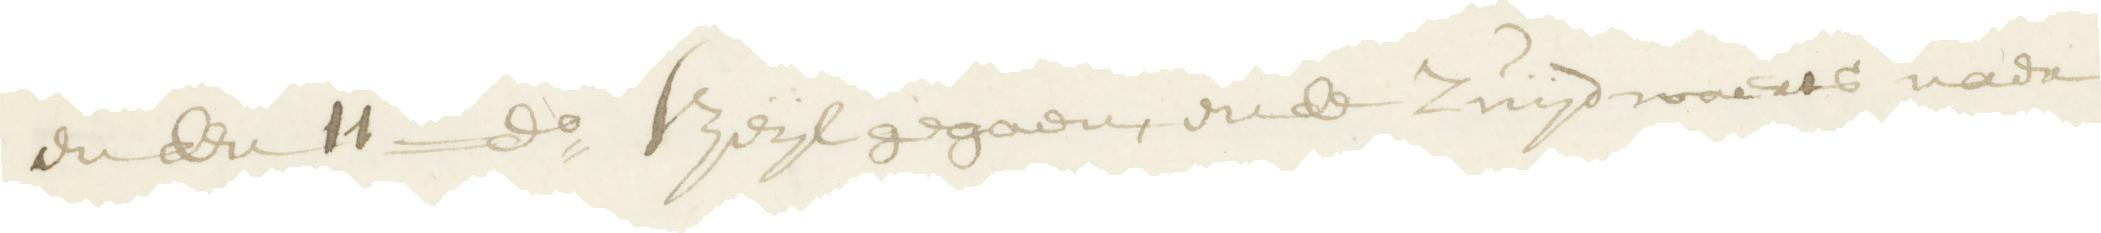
en den 11e d:o tzeijl gegaen, ende Zuijdwaerts naer
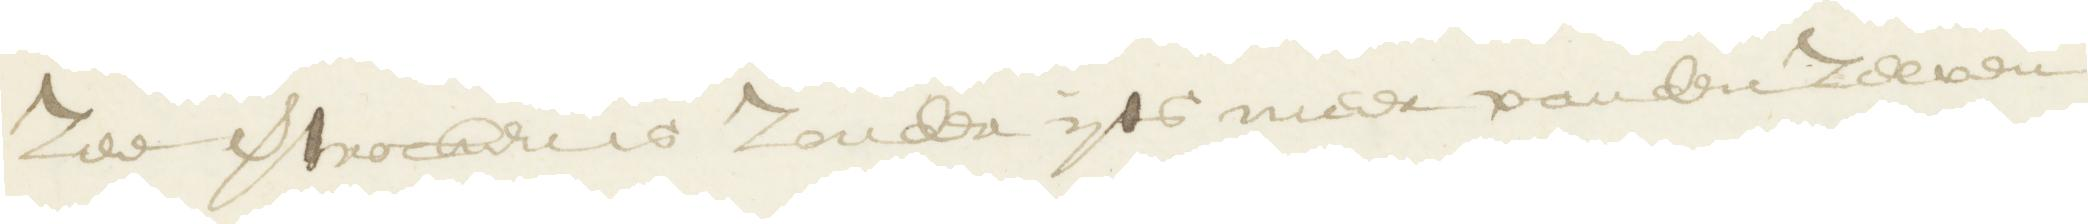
Zee vertrocken is Zonder ijts meer van den zelven
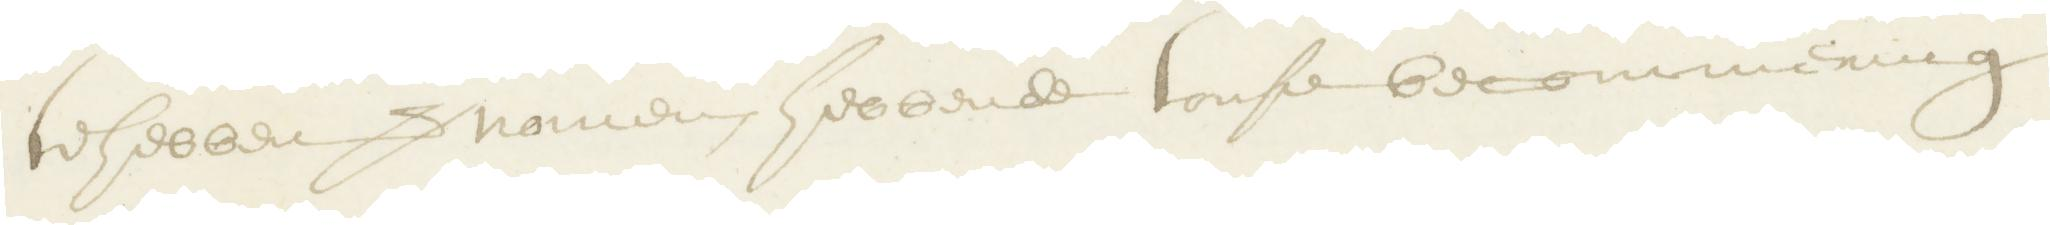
tehebben vernomen, hebbende tonse becommering
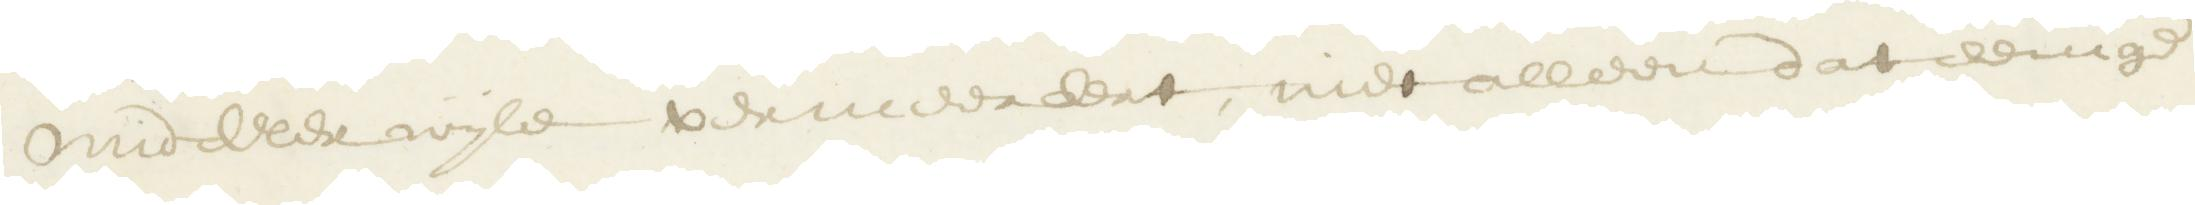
middeler wijle vermeerdert, niet alleen dat eenige
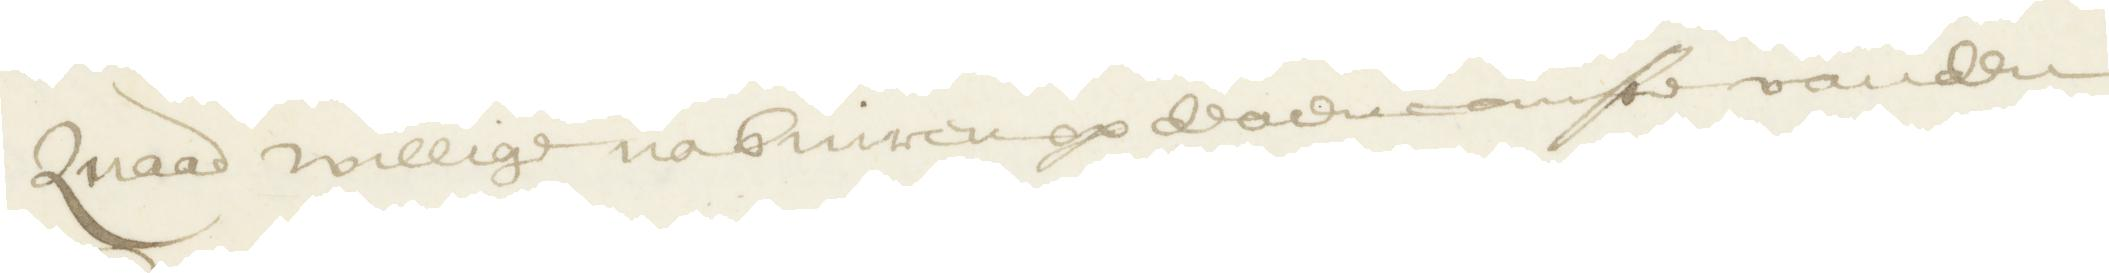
Quaad willige nabuiren op deaencomste vanden
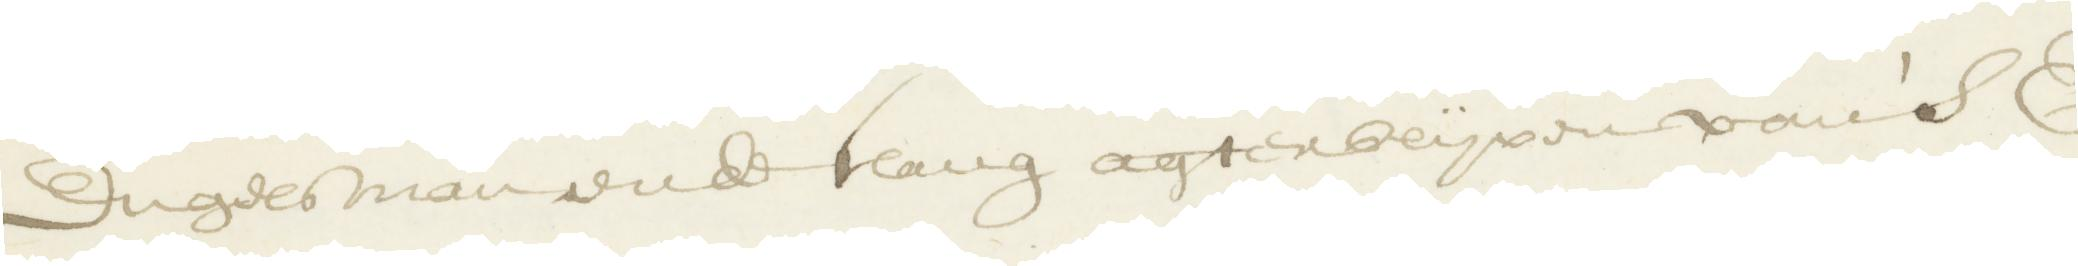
Engelsman ende tlang agterblijven van 'S E
